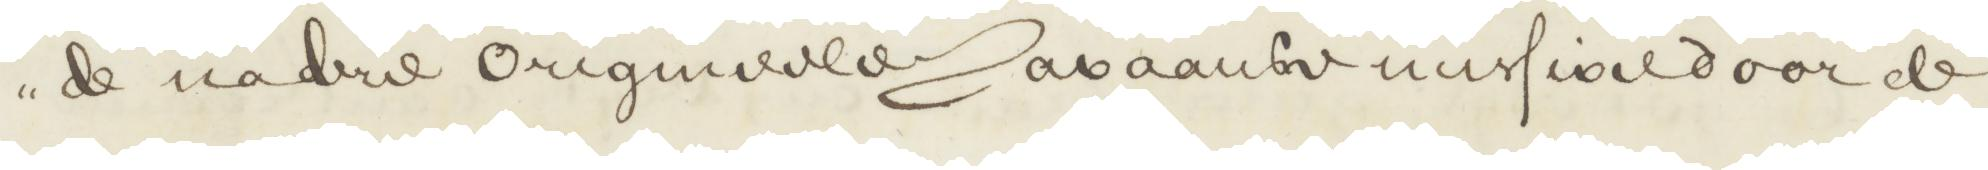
„de nadere origneele javaanse missive door de
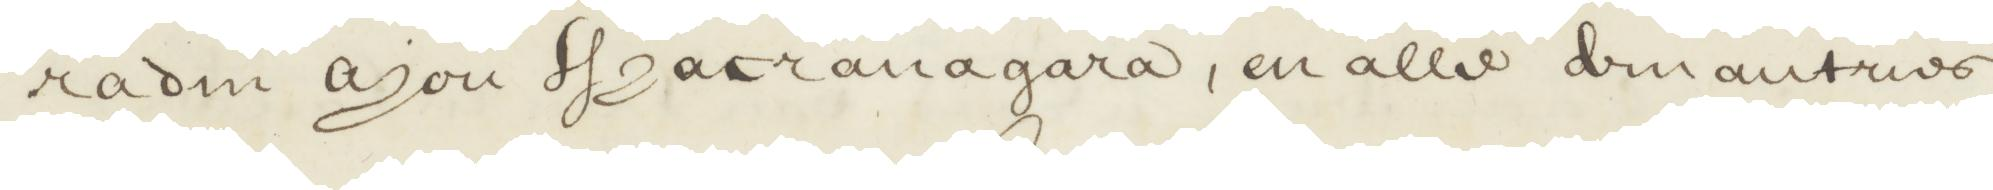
radin ajou tsjacranagara, en alle den antries
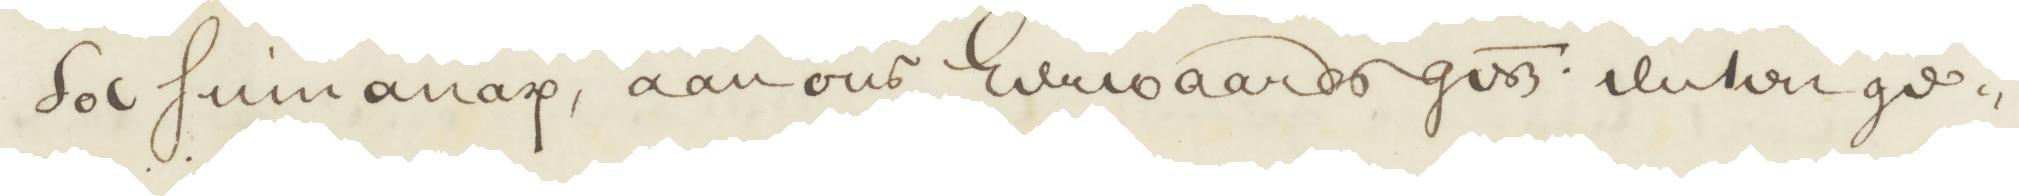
tot sumanap, aan ons herwaards gesz: en ten ge„
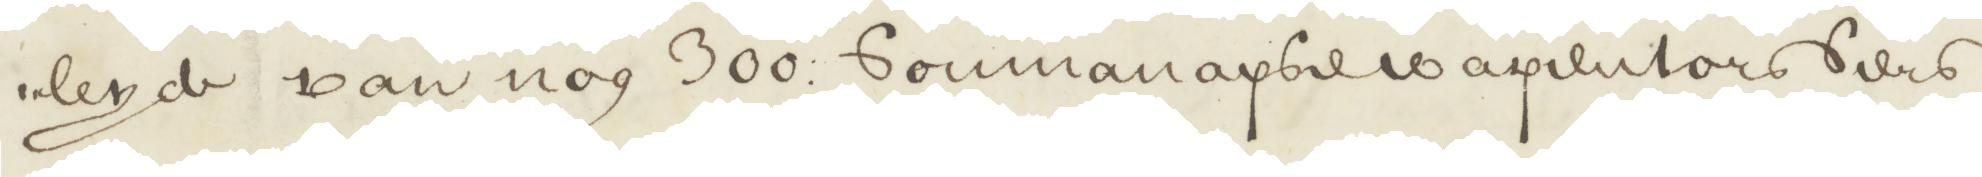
leijde van nog 300: soumanapse wapentorssers
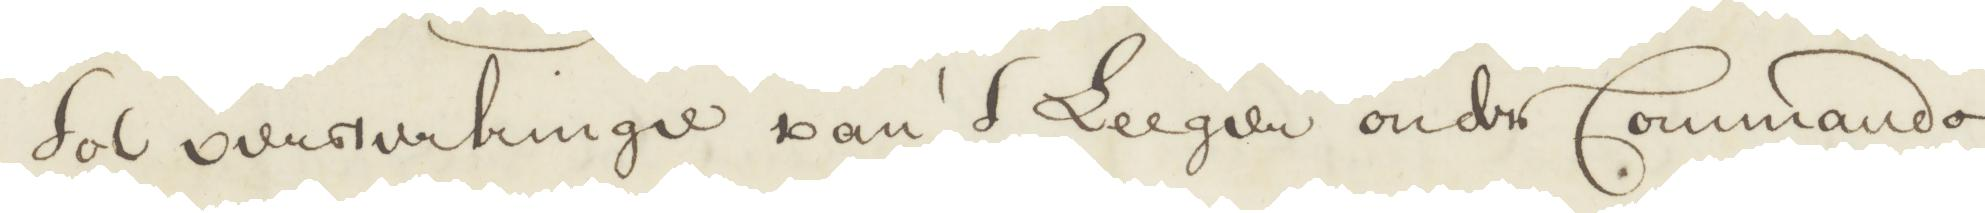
tot versterkinge van 't Leeger onder Commando
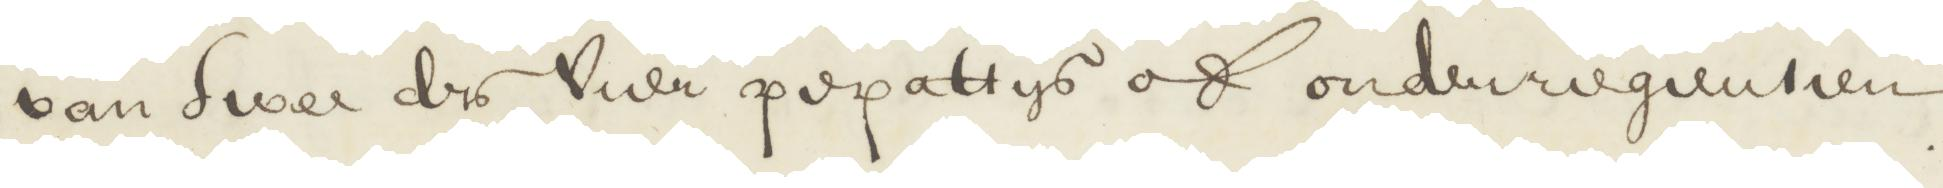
van twee der vier pepattijs of onder regenten
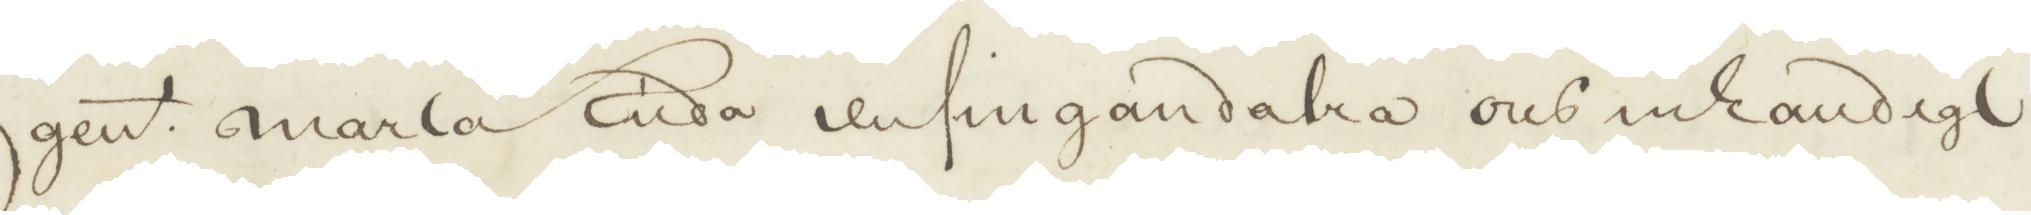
gen.t marta juda en singandaka ons in handigt
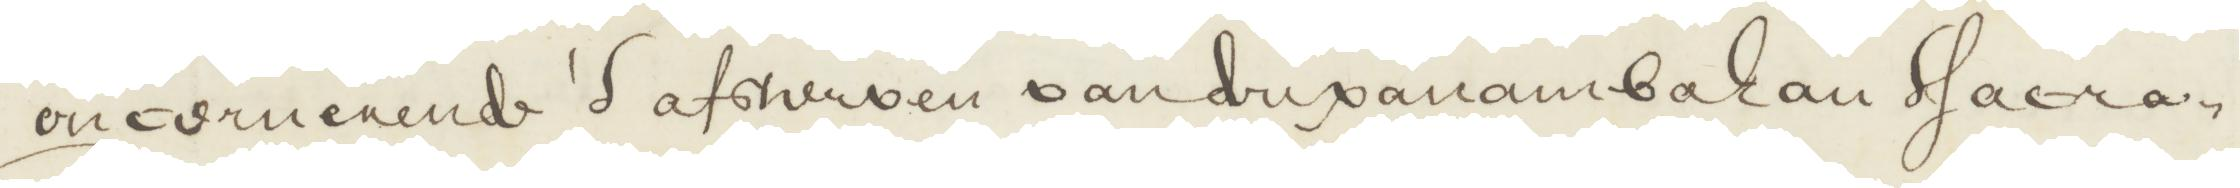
Concernerende 't afsterven van den panambahan tsacra„
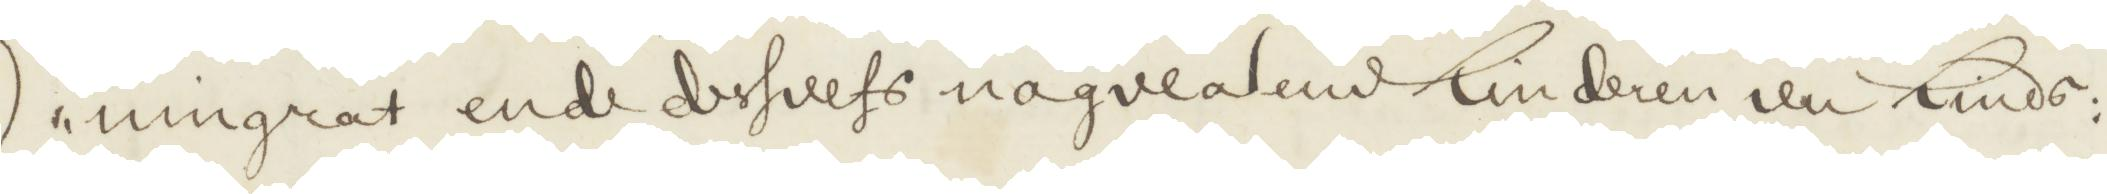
„ningrat ende desselfs nagelatene kinderen en kinds:
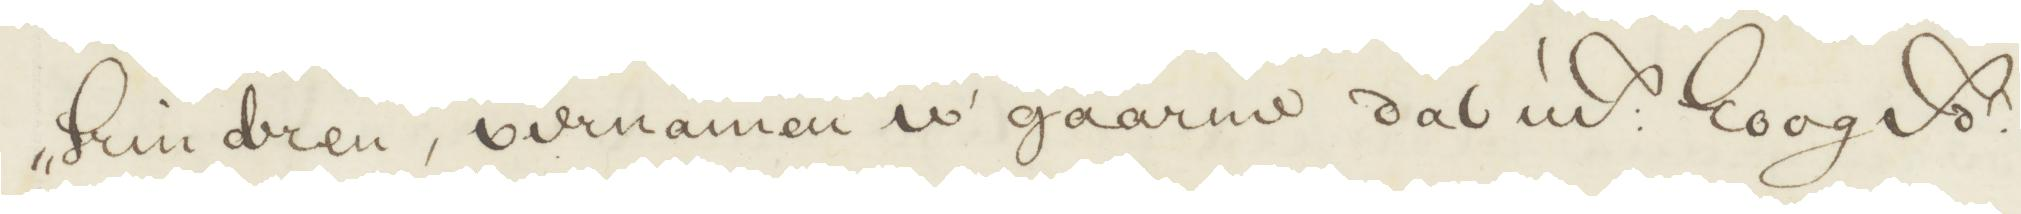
„kinderen, vernamen w' gaarne dat uE: Hoog Ed.'
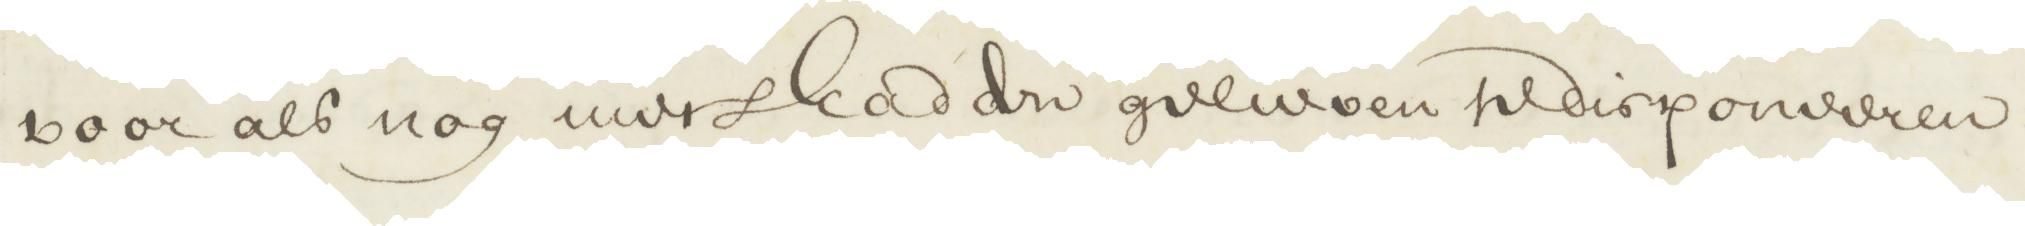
voor als nog niets hadden gelieven te disponeeren
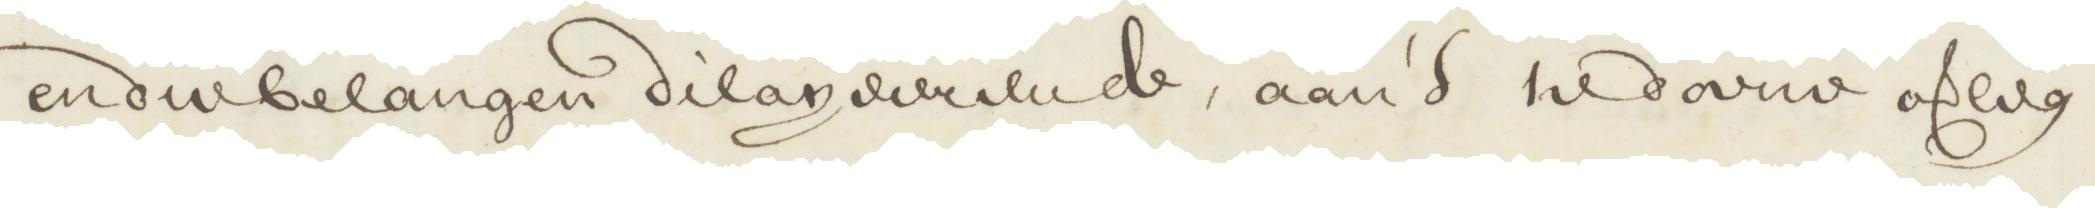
en die belangen dilaijeerende, aan 't te doene overleg
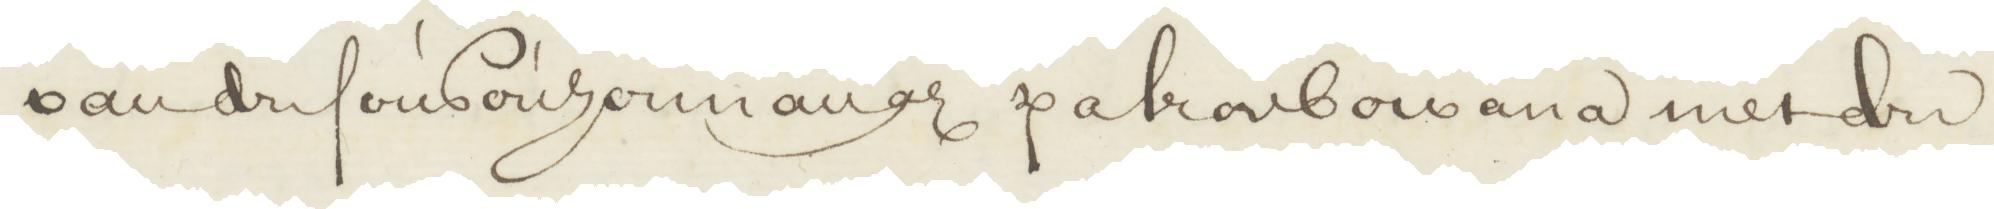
van den sousoujounangh pakoebowana met den
